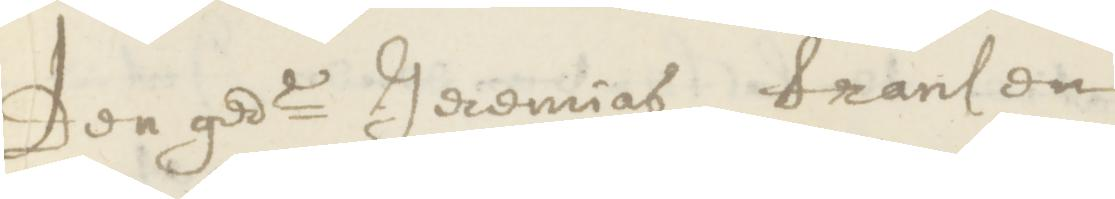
Der ged=e Jeremias fransen
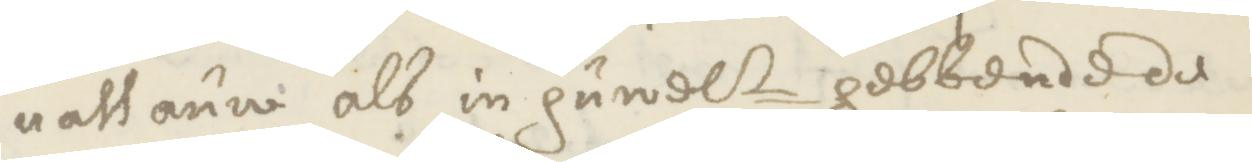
nassauw als in huwelijk hebbende de
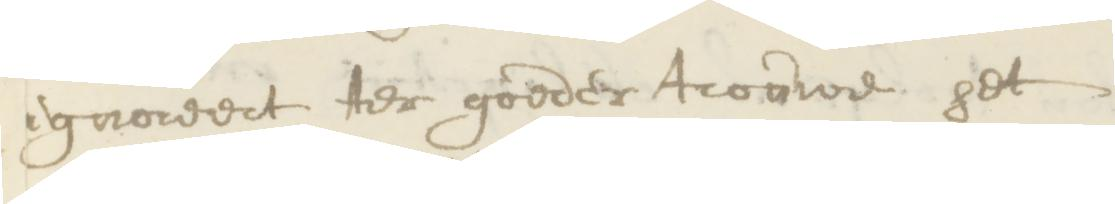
ignoreert ter goeder trouwe het
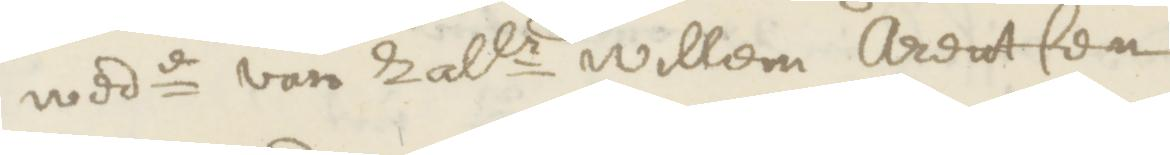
wed=e van zal=lr willem arentsen
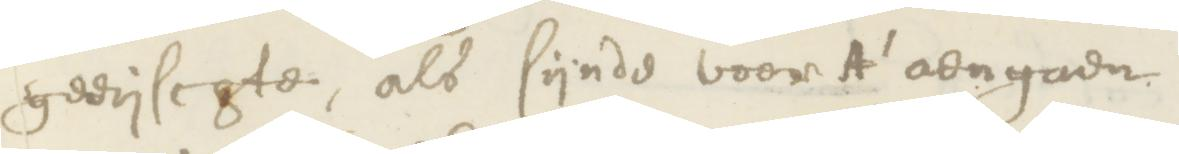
geeijschte, als sijnde voor t' aengaen
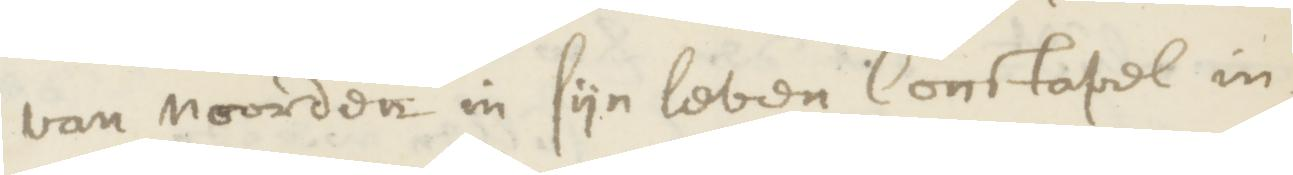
van noorden in sijn leven Constapel in
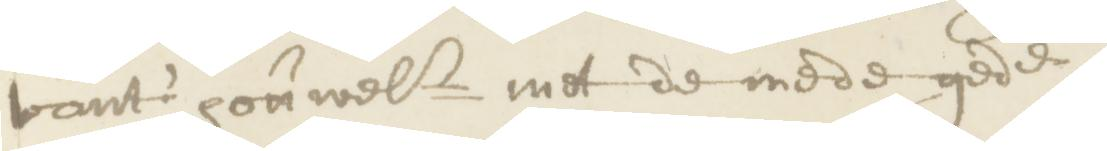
vant' houwelijk met de mede gede
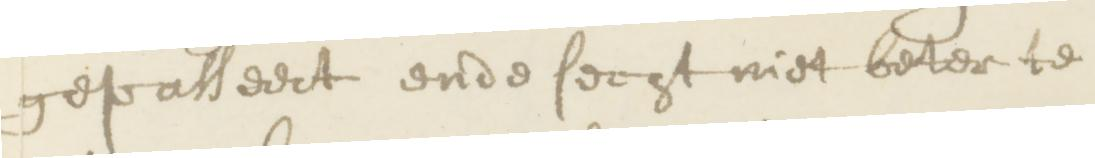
gepasseert ende secht niet beter te
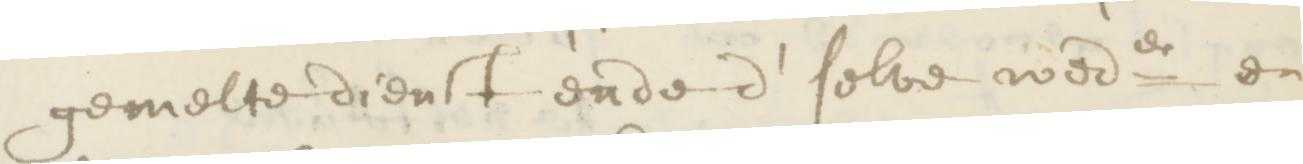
gemelte dienst ende d’ selve wed=e en
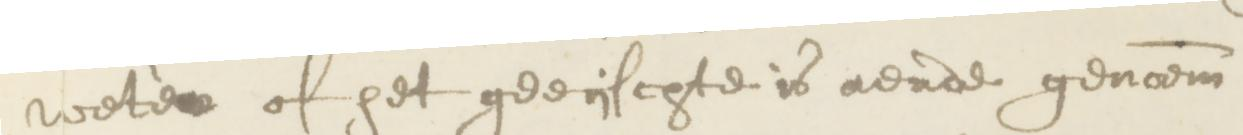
weten of het geeijschte is aende genoem
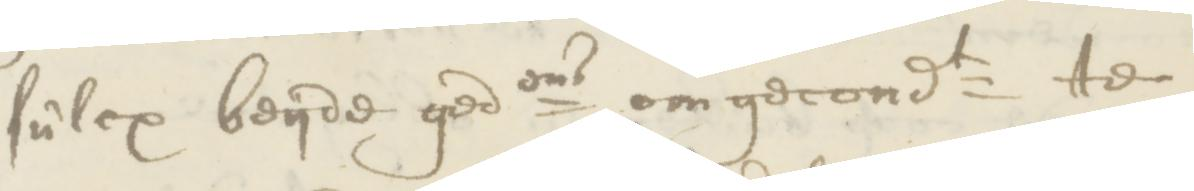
sulcx beijde ged=ens om gecond=t te
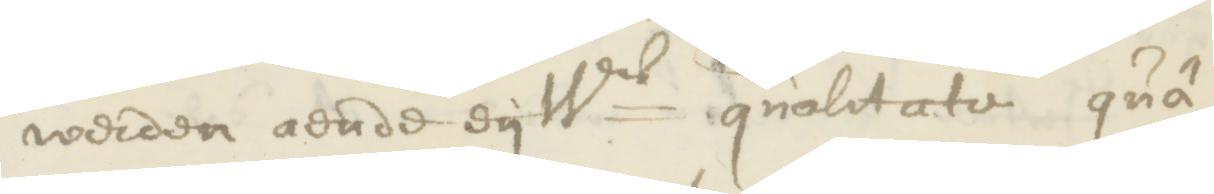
werden aende eijss=rs qualitate quâ
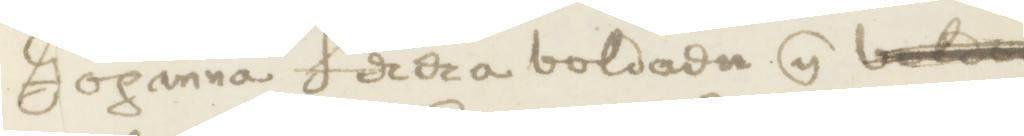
Johanna ferera voldaen ede voldaen
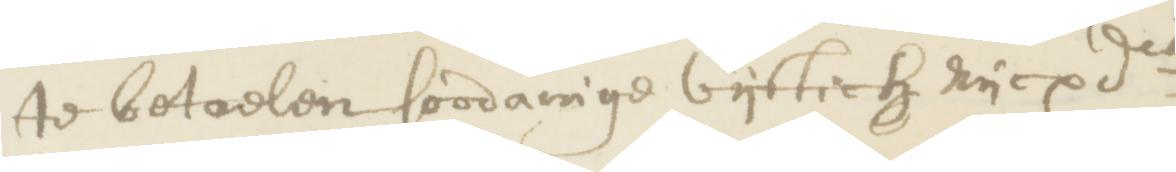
te betaelen soodanige vijftich rijcxd=rs
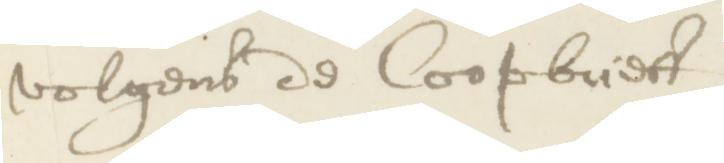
volgens de Coopbrieff
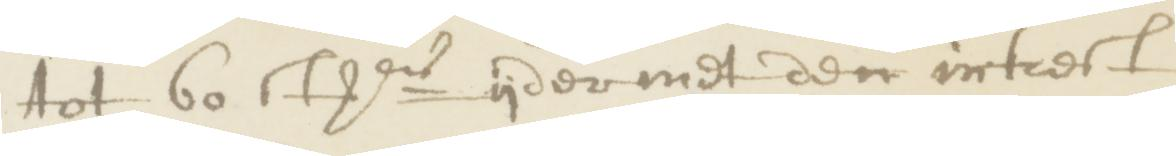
tot 60 stver=rs ijder met den intrest
